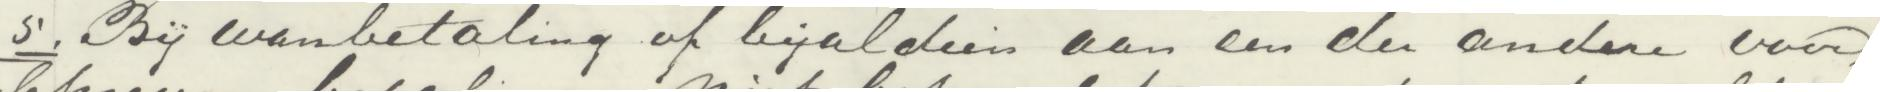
5. Bij wanbetaling of bij aldien aan een den andere voor
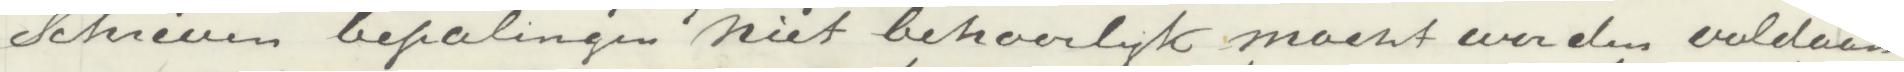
schreven bepalingen niet behoorlijk mocht worden voldaan
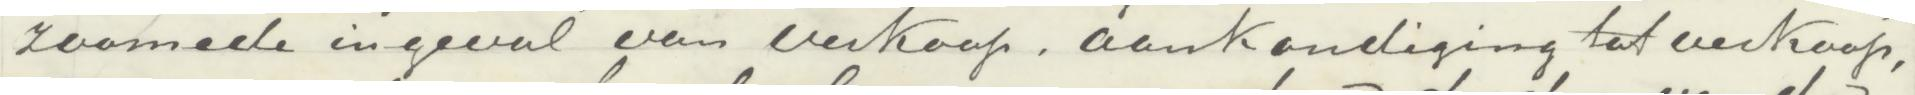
zoomede ingeval van verkoop, aankondiging tot verkoop,
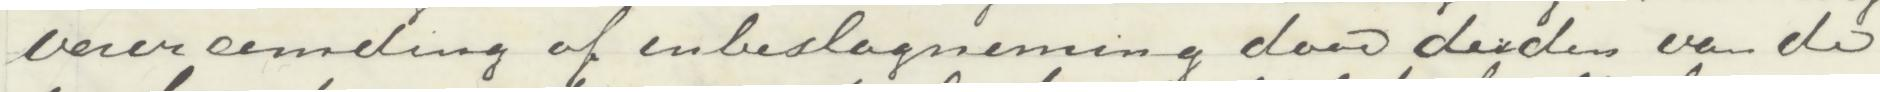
vervreemding of inbeslagneming door derden van de
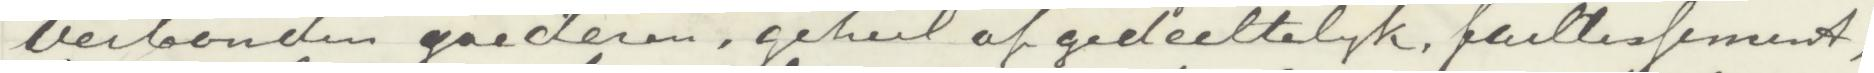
verbonden goederen, geheel of gedeeltelyk, faillisement,
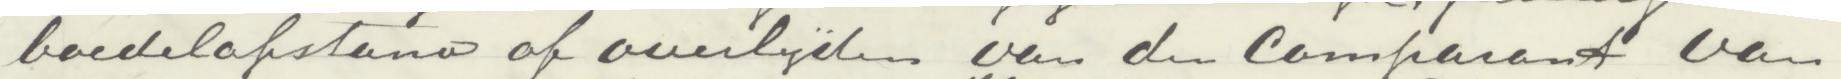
boedelafstand of overlijden van den Comparant van
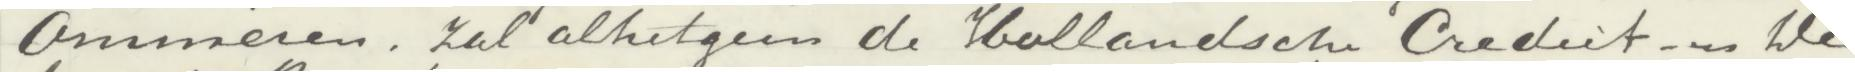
Ommeren, zal alhetgeen de Hollandsche Crediet- en De
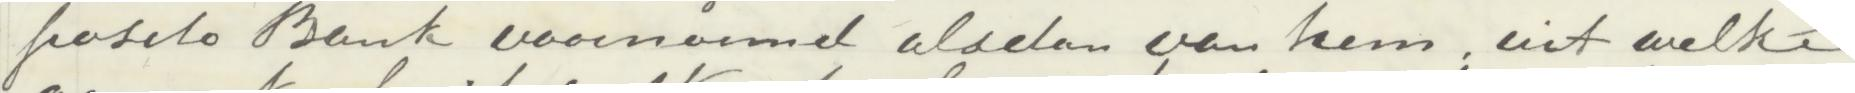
posito Bank voornoemd alsdan van hem, uit welke
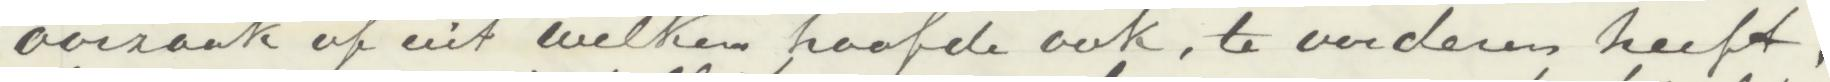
oorzaak of uit welken hoofde ook, te vorderen heeft,
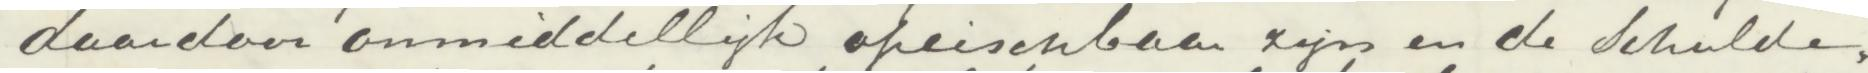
daardoor onmiddellijk opeischbaar zijn en de schulden,
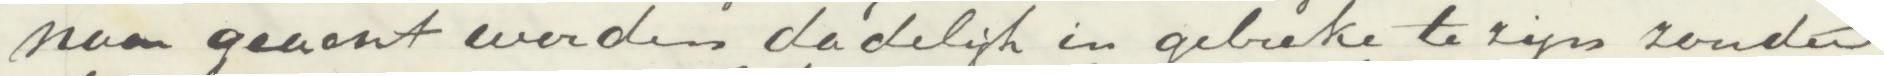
naar geacht worden dadelijk in gebreke te zyn zonder
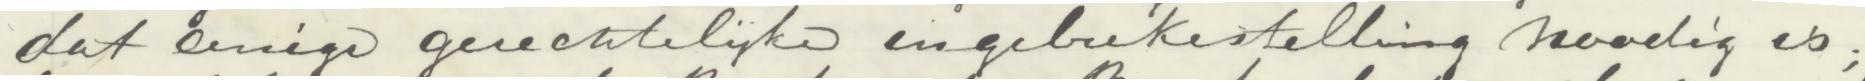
dat eenige gerechtelijke ingebrekestelling noodig is;
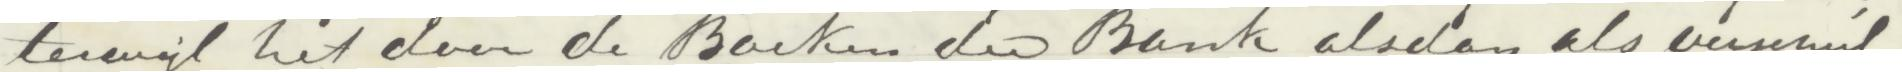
terwijl het door de Boeken der Bank alsdan als verschul,
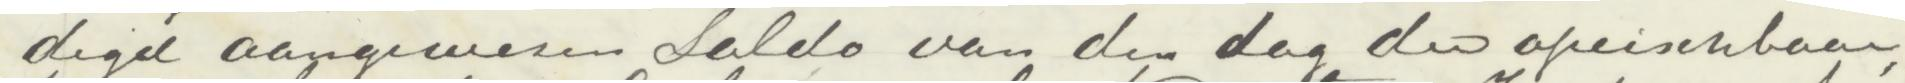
digd aangewezen Saldo van den dag der opeischbaar,
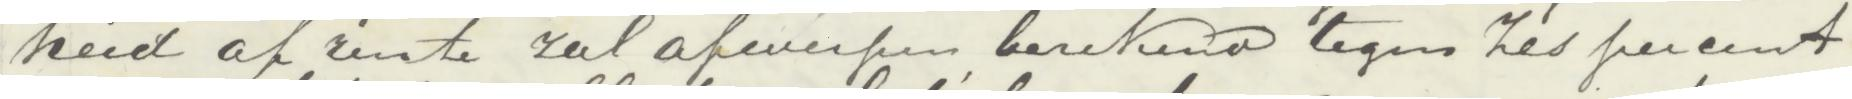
heid of rente zal opwerpen, berekend tegen zes per cent
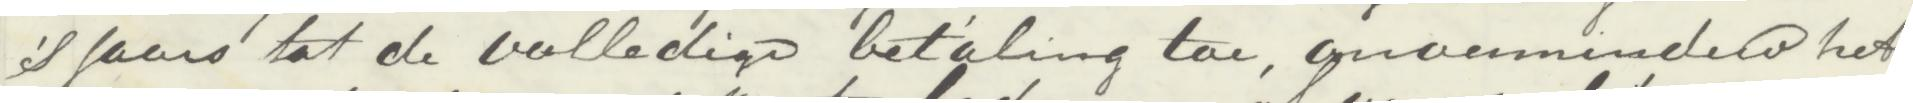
's jaars tot de volledige betaling toe, onverminderd het
